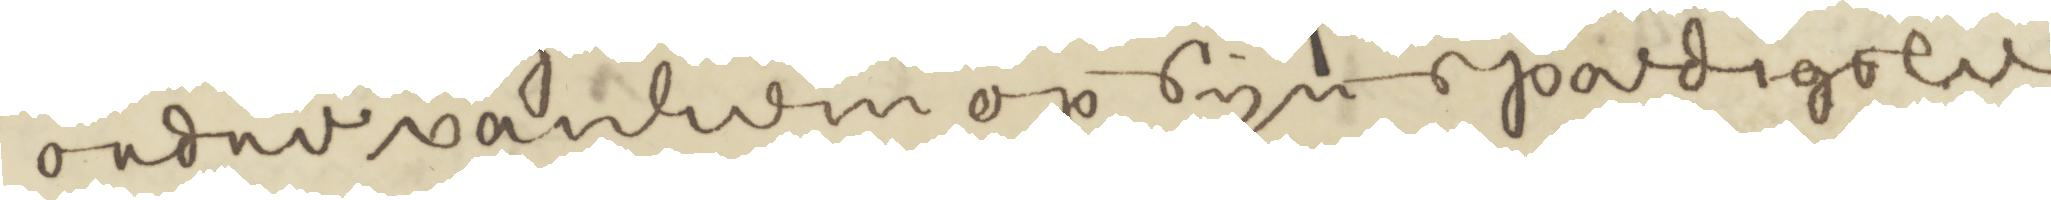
ordre van hem op sijn spoedigste
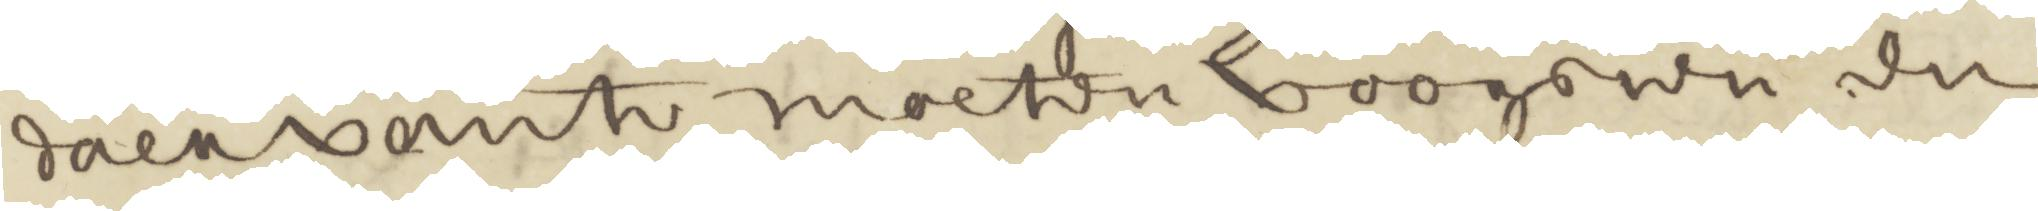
daervan te moeten voorsien en
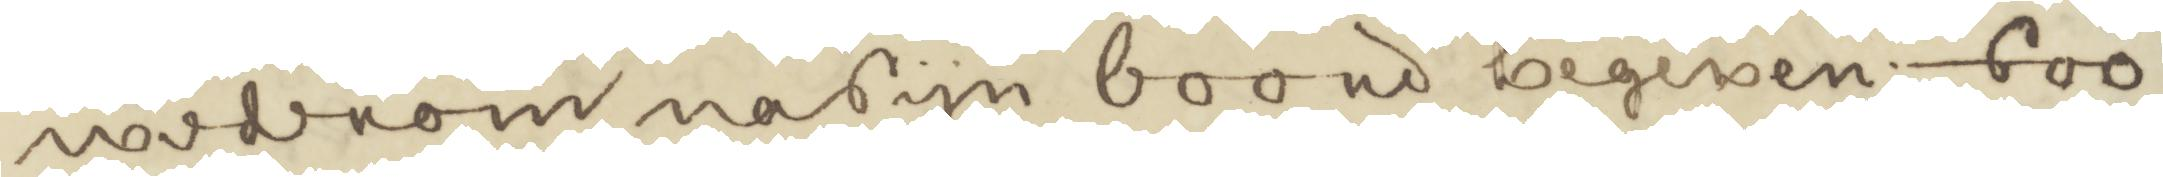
wederom na sijn boord begeven; soo
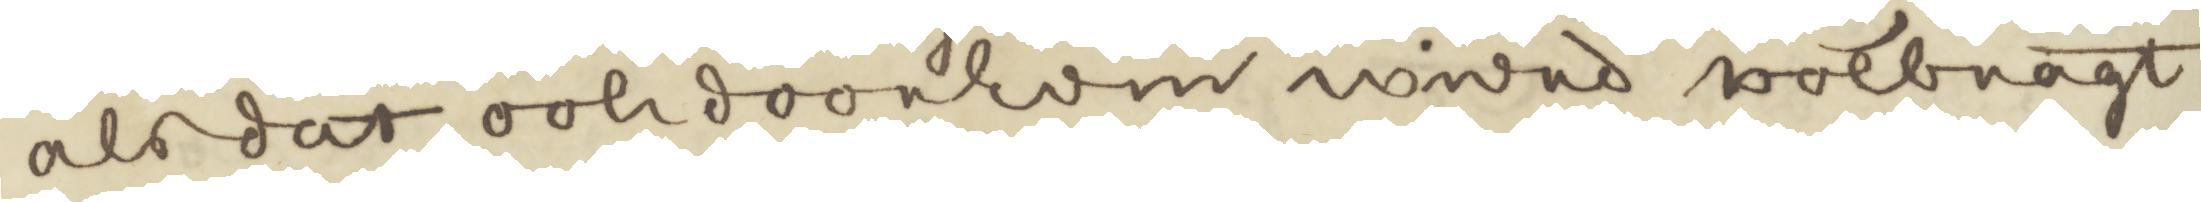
als dat ook door hem wierd volbragt
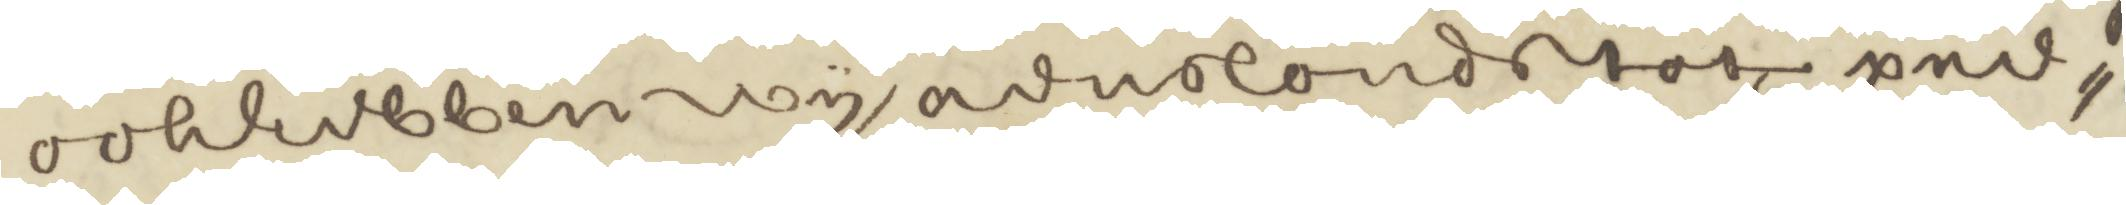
ook hebben wij aenstonds tot pre„
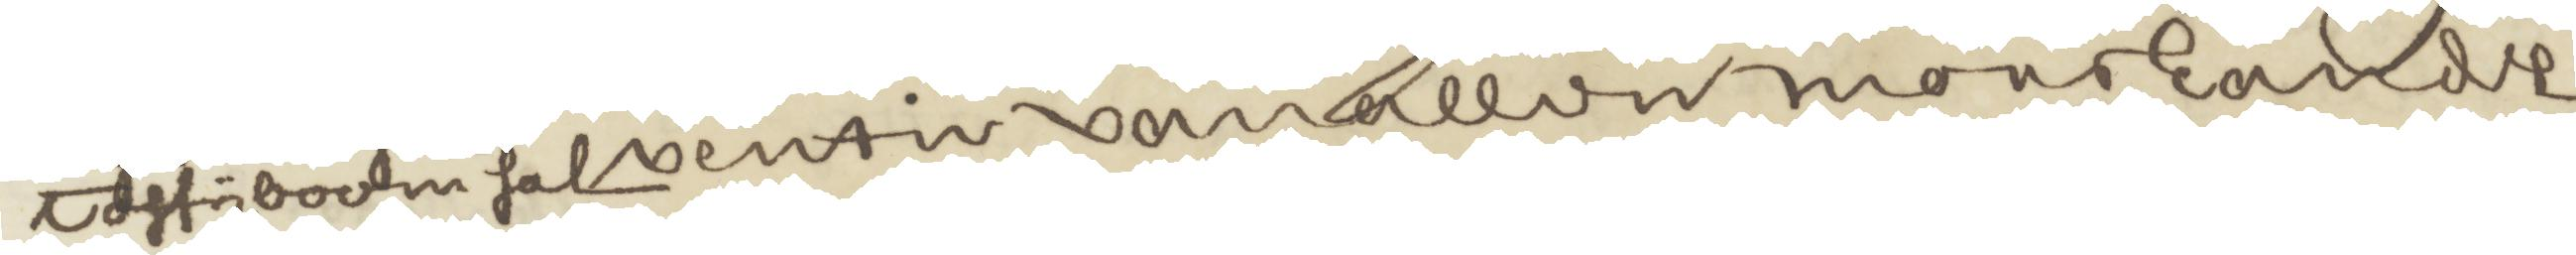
Coffijboom sal ventie van allen morshandel
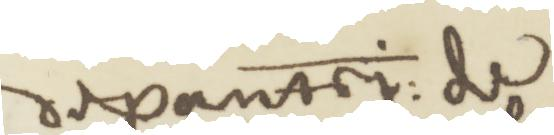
de pantsj: de
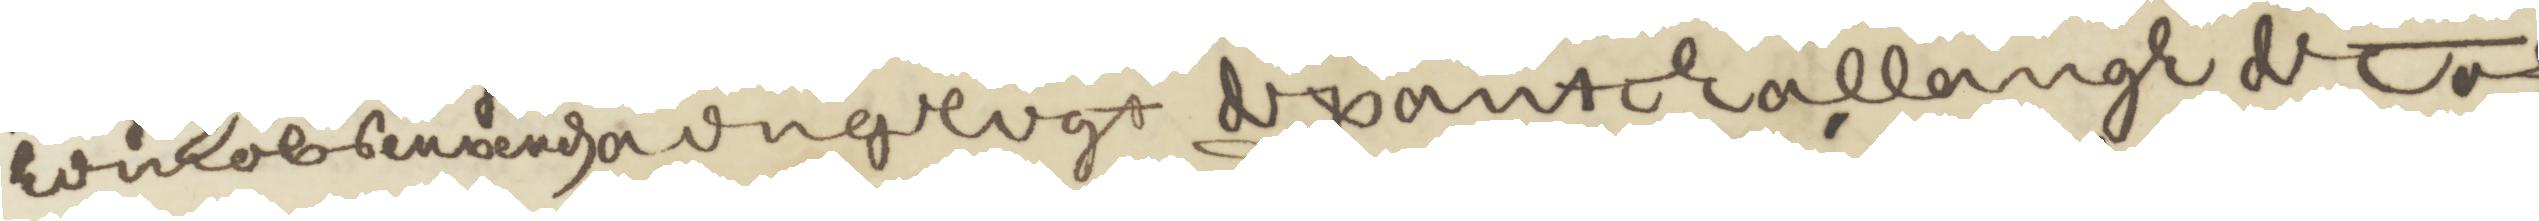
hem observeren aengelegt de pantchallangh de Coffij
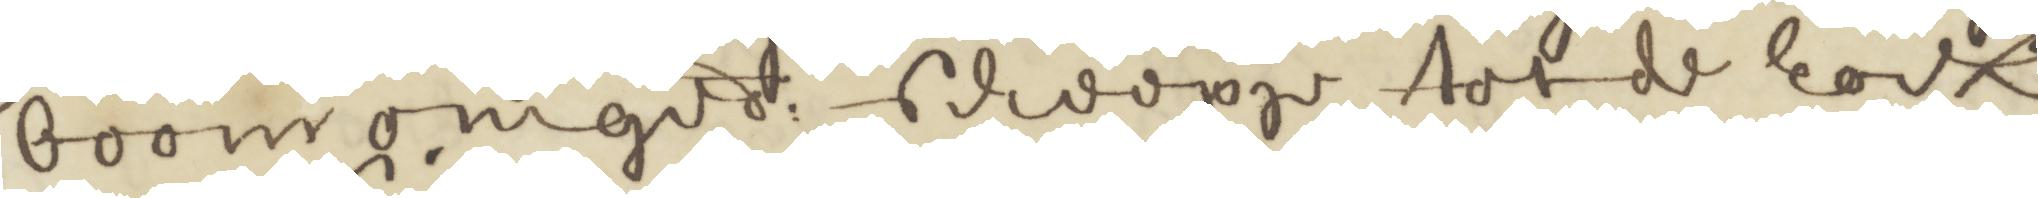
boom om ged: scheepje tot de hoek
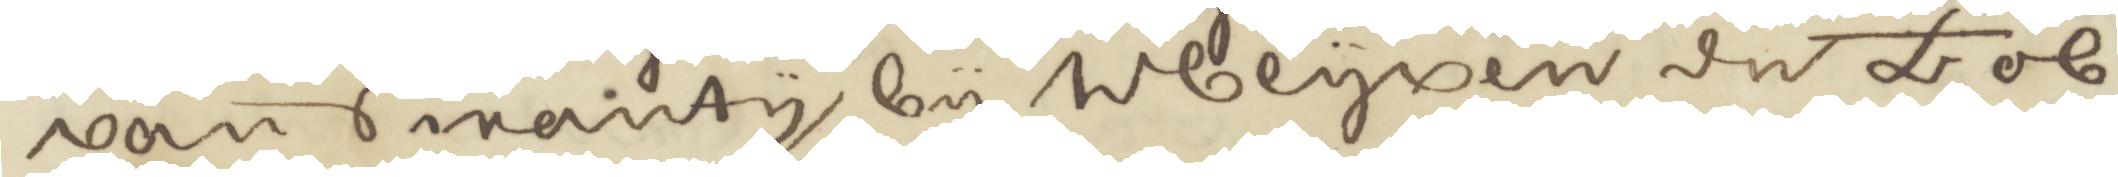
van sirantij bij te blijven en te ob
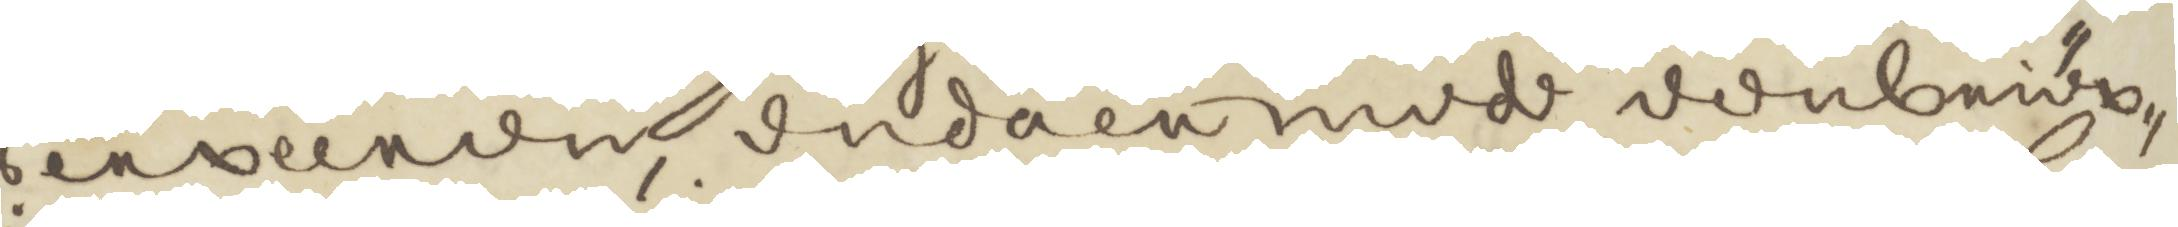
serveeren, en daer mede een briev„
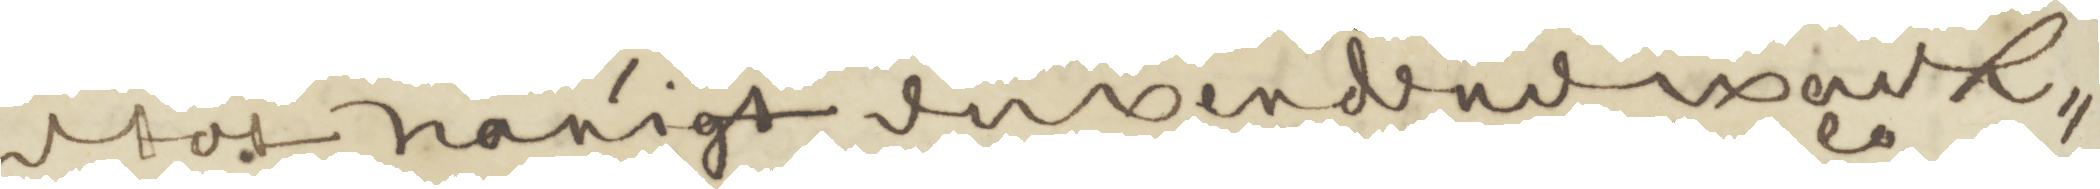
je tot narigt en verdere waek„
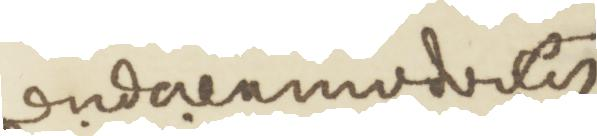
en daermede een
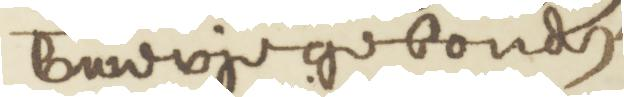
brievje gesonden
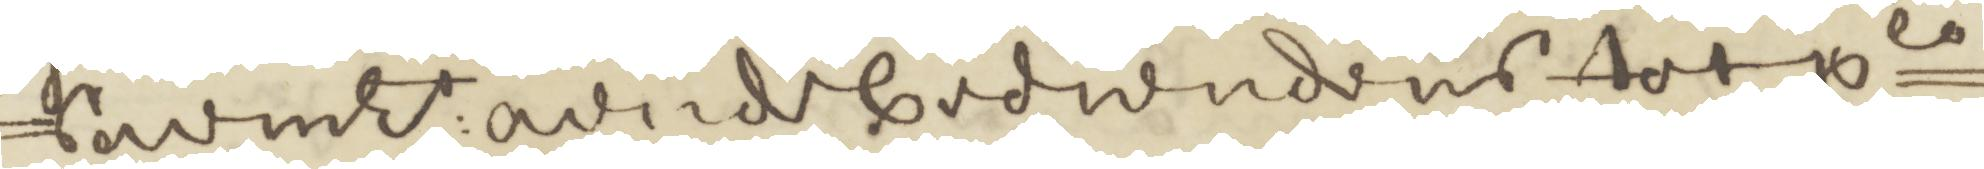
saemh:t aen de bediendens tot p=lo
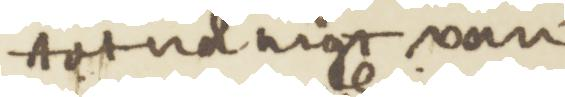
tot narigt van
